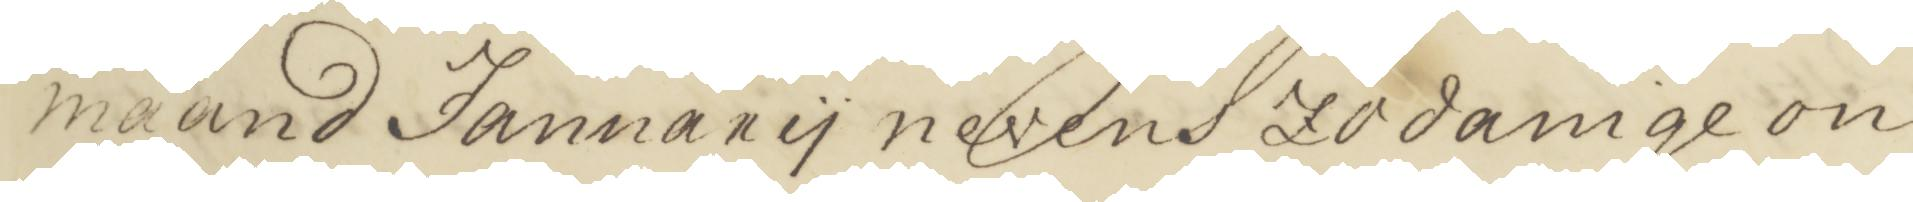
maand Ianuarij nevens zodanige on
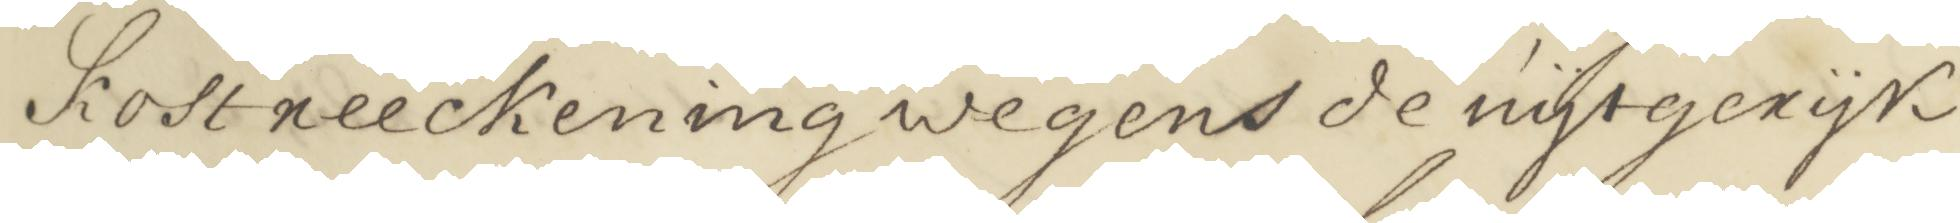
kostreeckening wegens de uijtgerijk
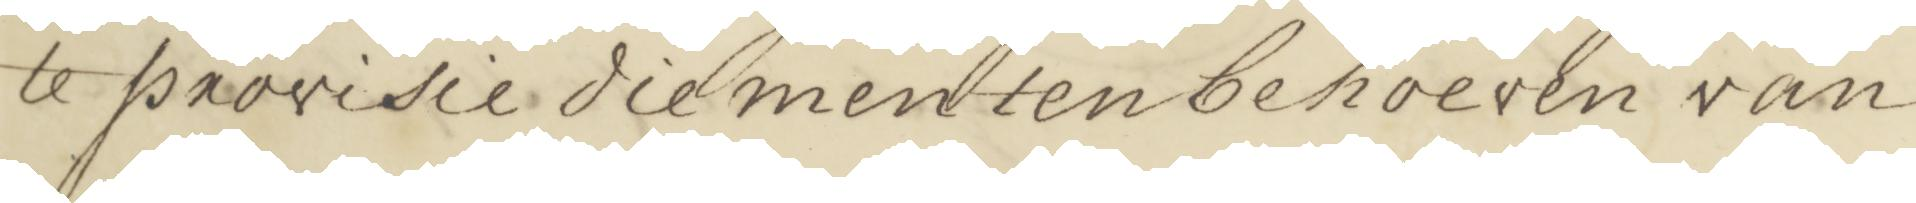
te provisie die men ten behoeven van
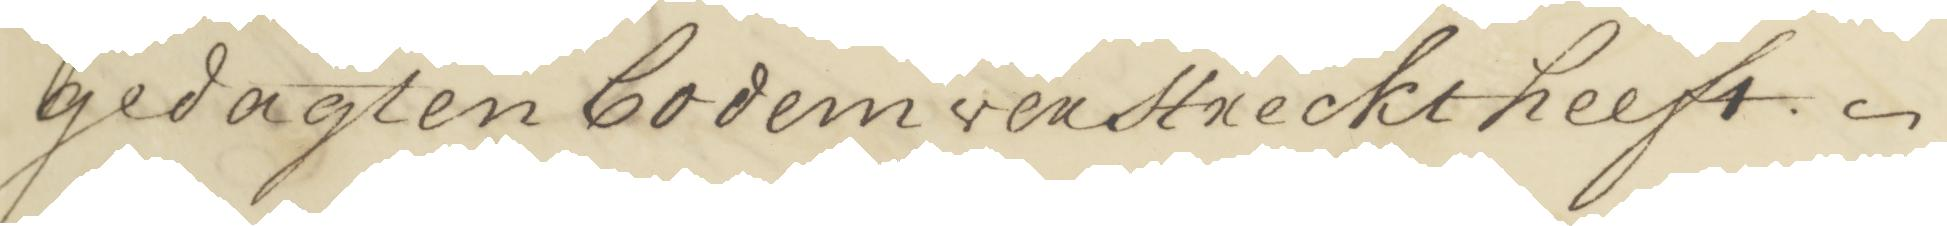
gedagten bodem verstreckt heeft. ~
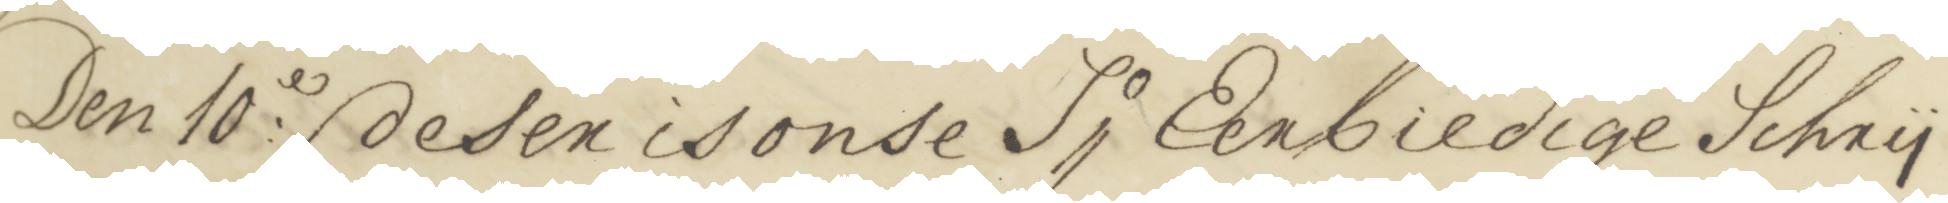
Den 10:e deser is onse I„o Eerbiedige Schrij
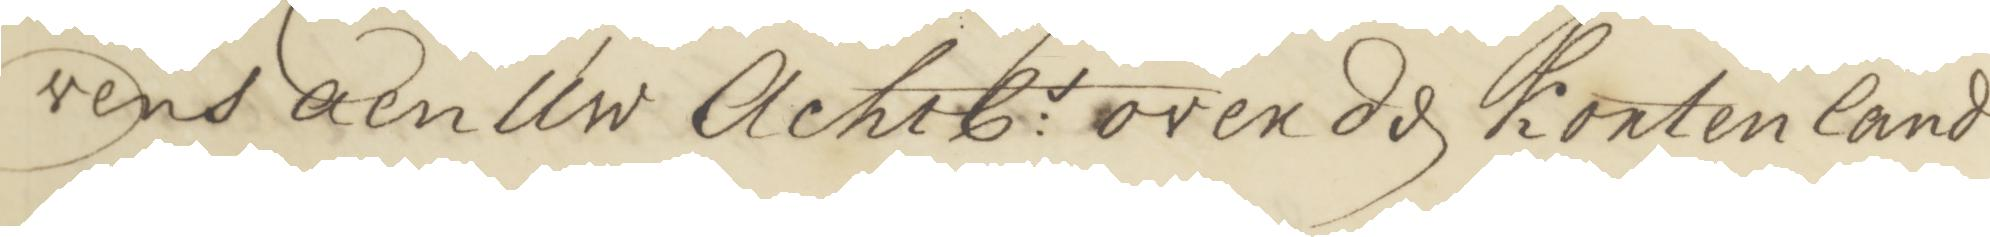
vens aen uw Achtb:s over den korten land
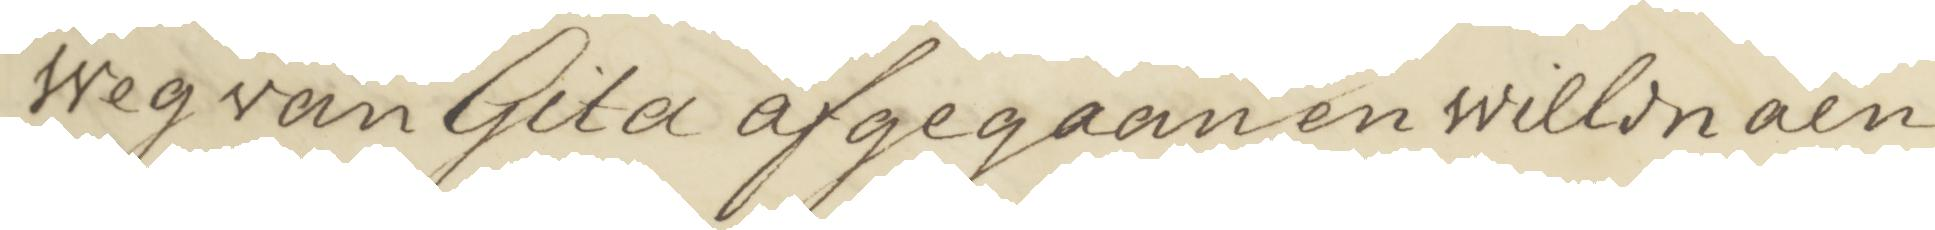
weg van Gita afgegaan en willen aen
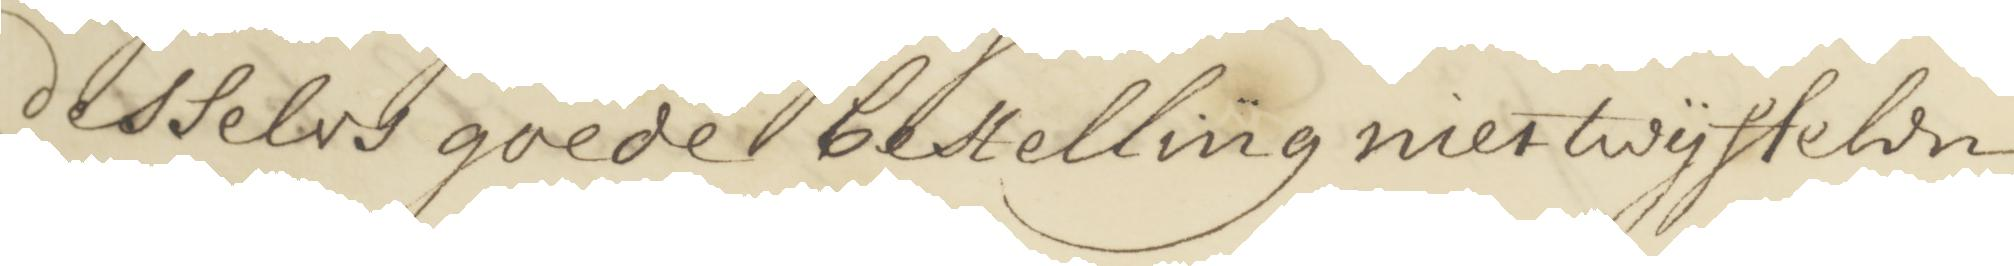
desselvs goede bestelling niet twijffelen
